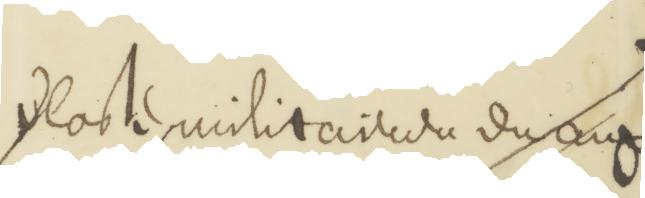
poste militairen en an
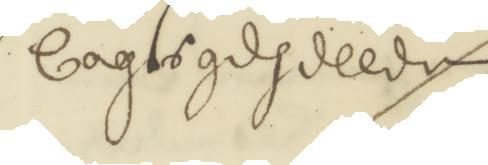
bagts gesellen
